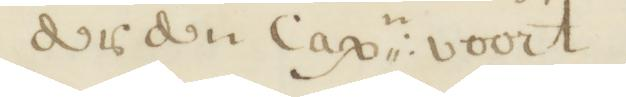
der den Cap„n: voor't
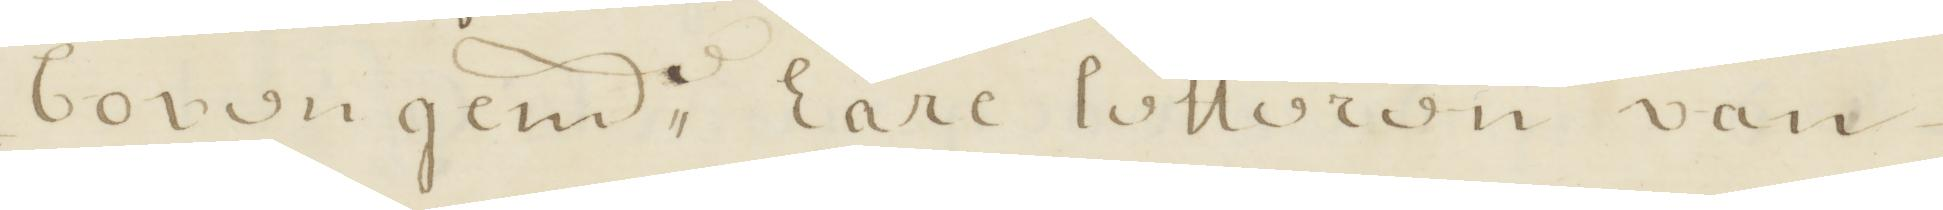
boven gem„e hare letteren van
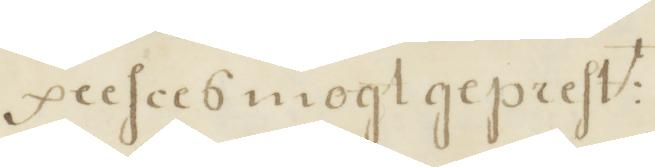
peesces mogt geprest:t
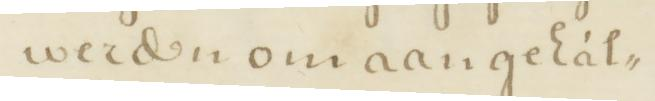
werden om aangehál„
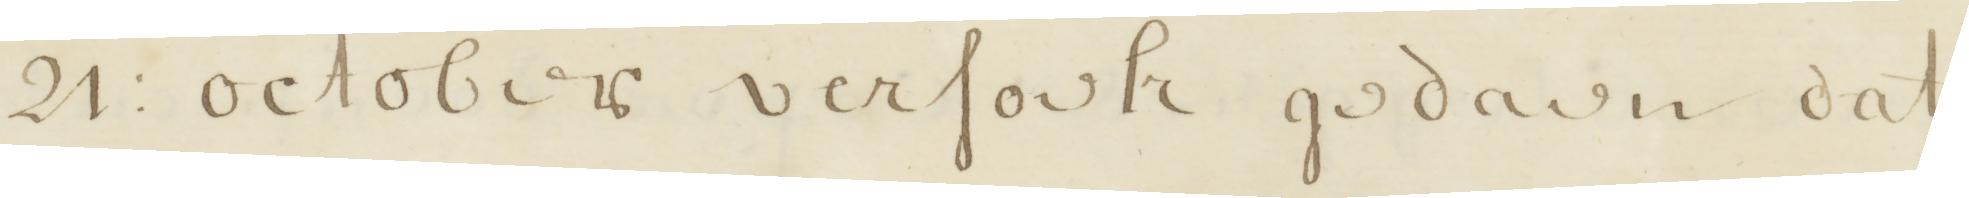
21: october versoek gedaen dat
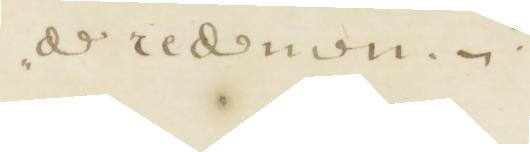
„de redenen.
